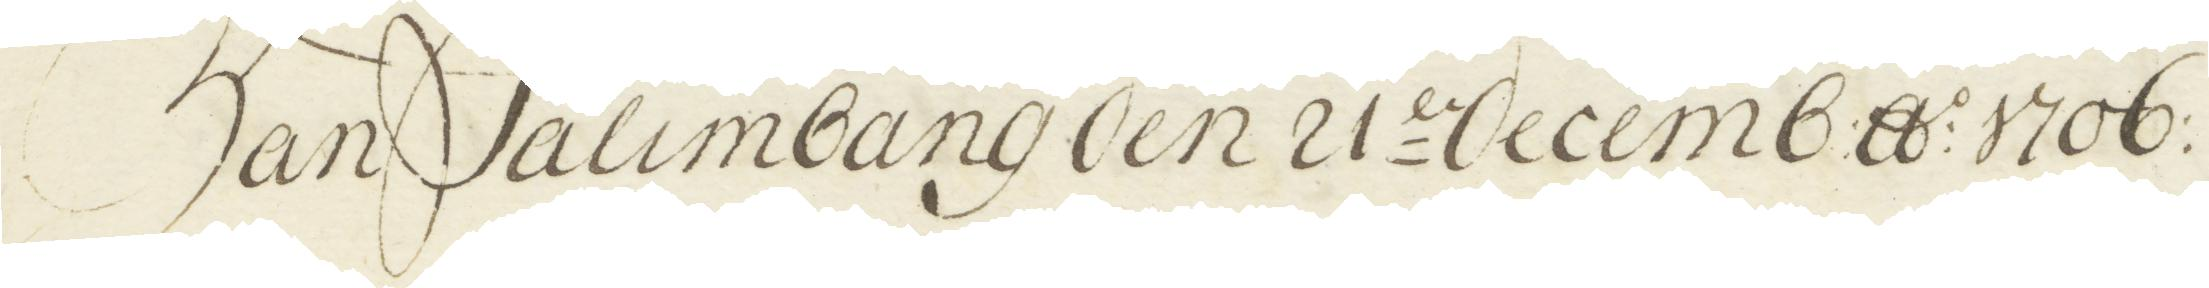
Van Palimbang den 21=e decemb:r A:o 1706:
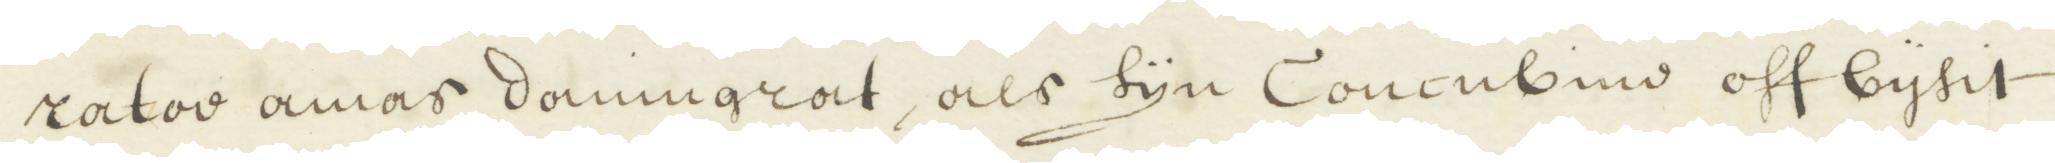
ratoe amas daningrat, als sijn Concubine off bijsit
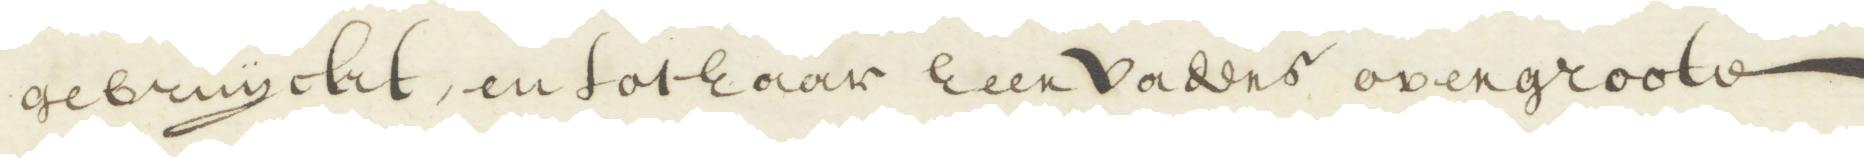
gebruijckt, en tot haar heer vaders overgroote
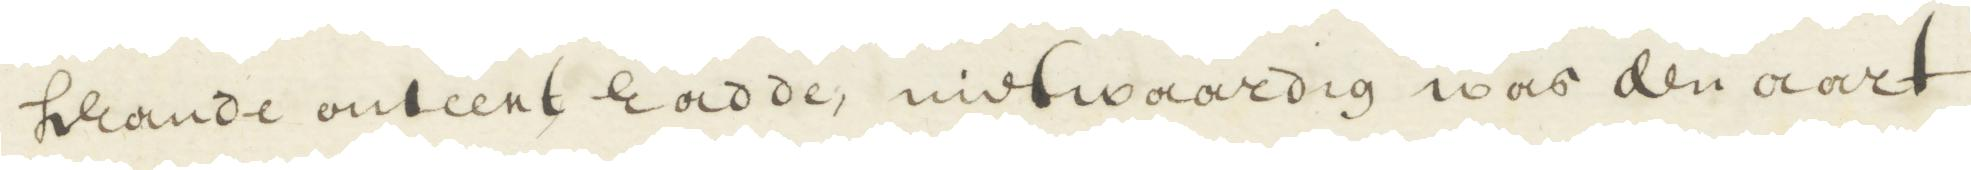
schande onteert hadde, nietwaardig was den aart
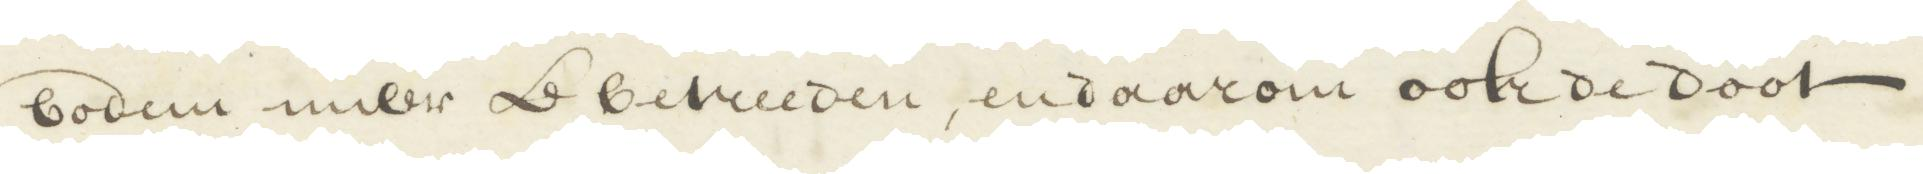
bodem meer te betreeden, en daarom ook de doot
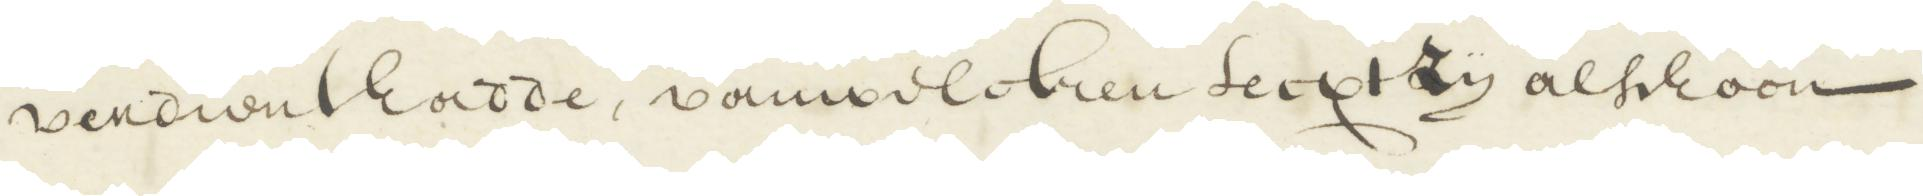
verdient hadde, vanwelcken tecxt zij alschoon
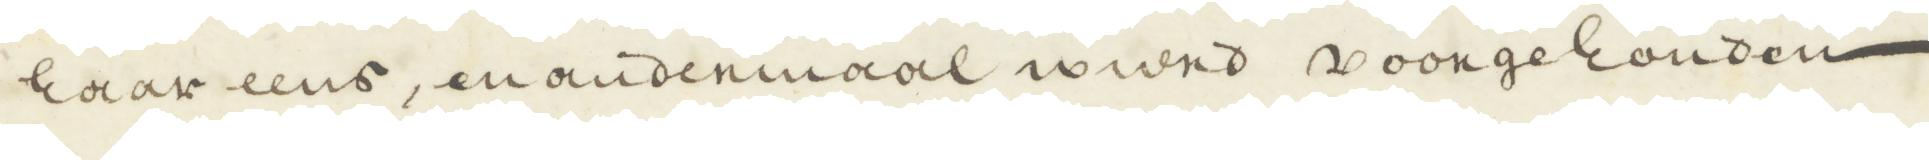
haar eens, en andermaal wierd voorgehouden
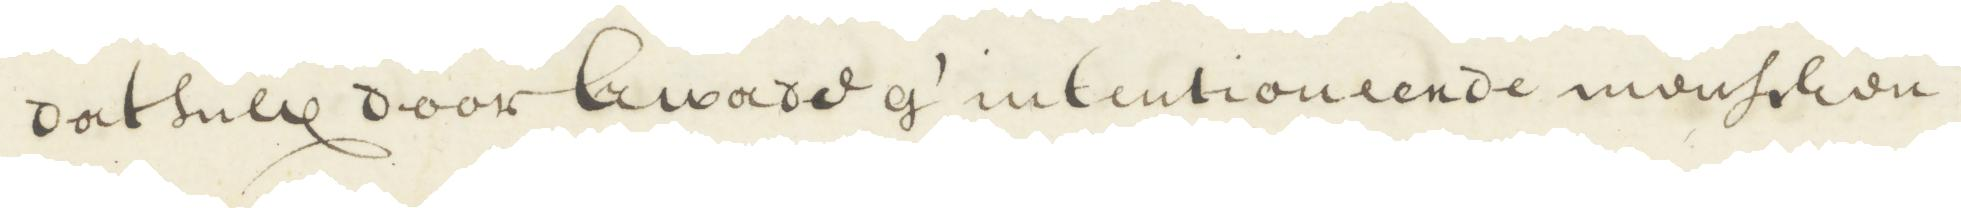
dat sulx door kwade g’ intentioneerde menschen
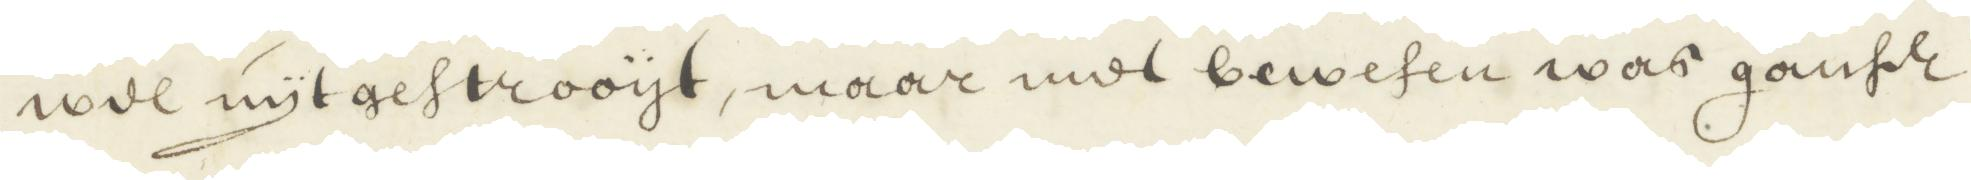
wel uijtgestrooijt, maar niet bewesen was gansch
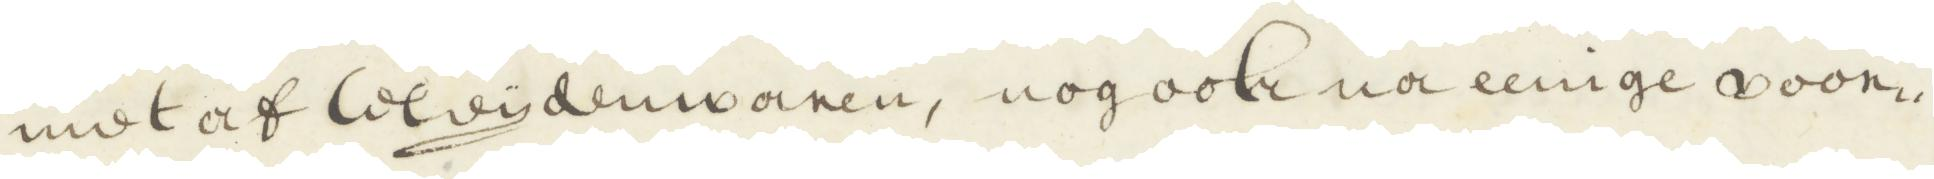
niet af teleijdenwaren, nog ook na eenige voor„
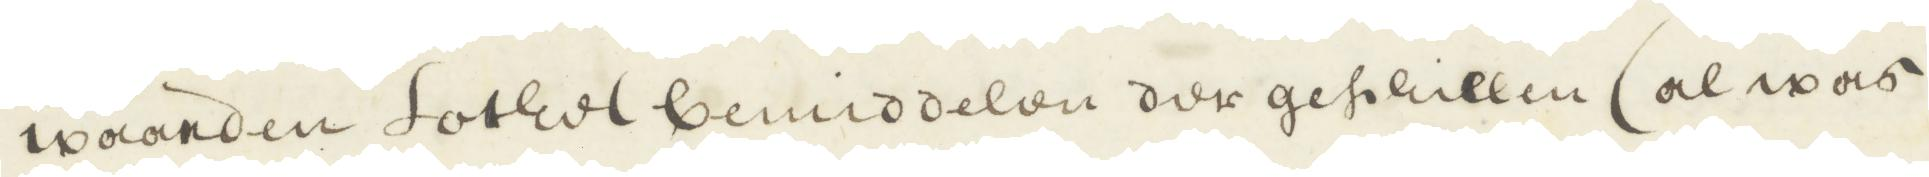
waarden tothet bemiddelen der geschillen (al was
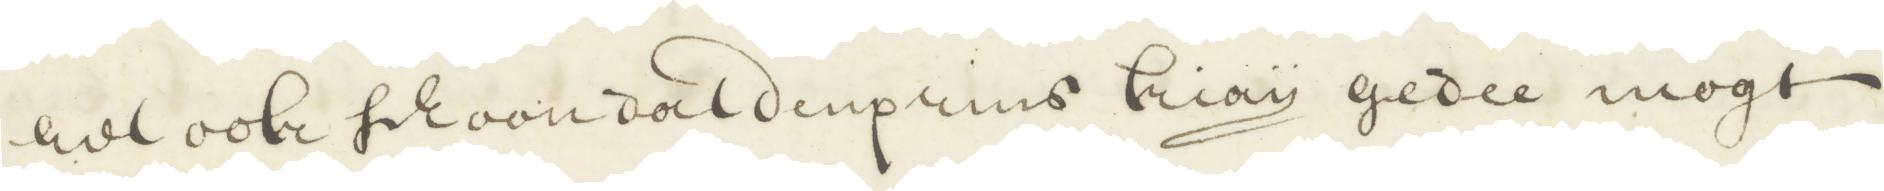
het ook schoon dat den prins kiaij gedee mogt
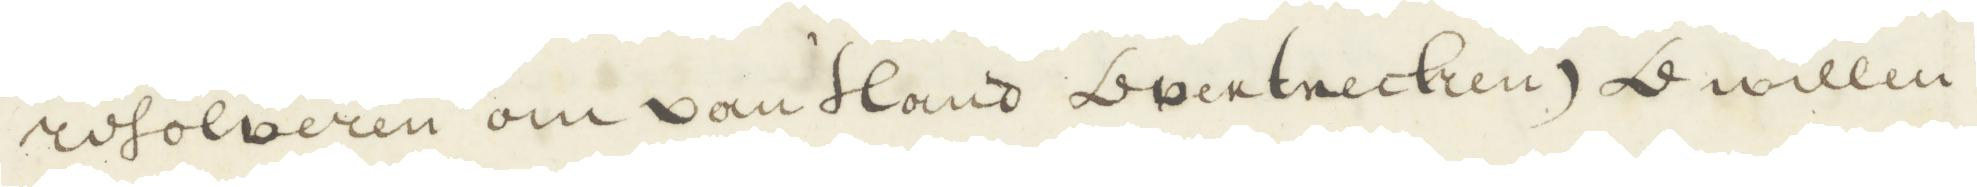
resolveren om van 'tland te vertrecken) te willen
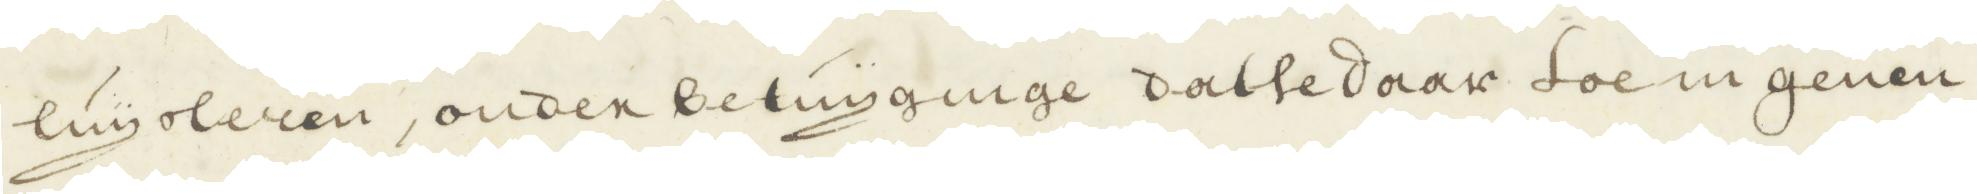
luijsteren, onder betuijginge datse daar toe in genen
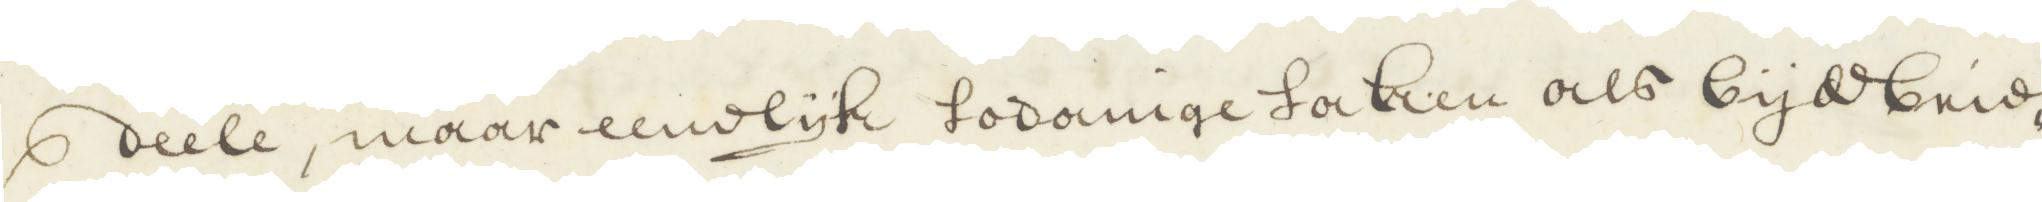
deele, maar eenelijk sodanige saken als bij de brie„
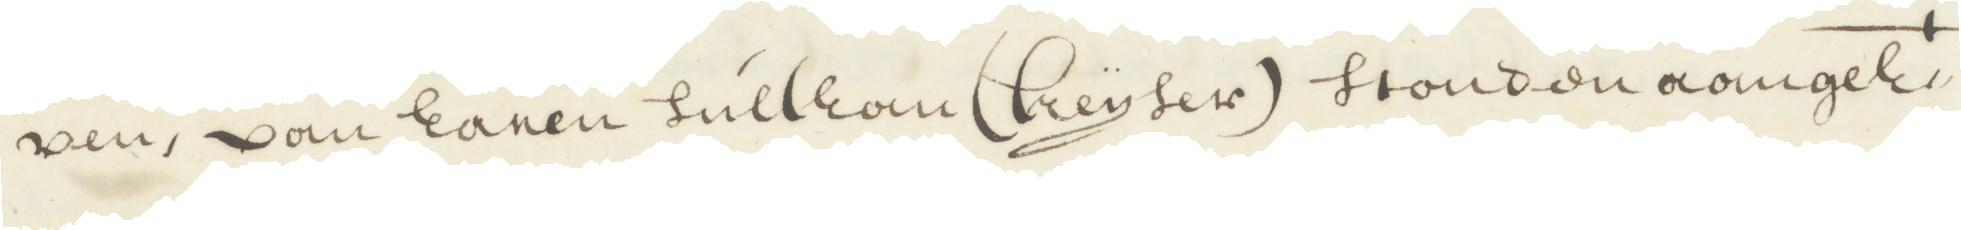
ven, van haren sulthan (keijser) stonden aangeh„t
